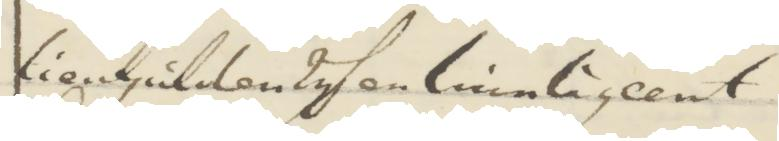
tien Gulden Vyfentwintig cent
